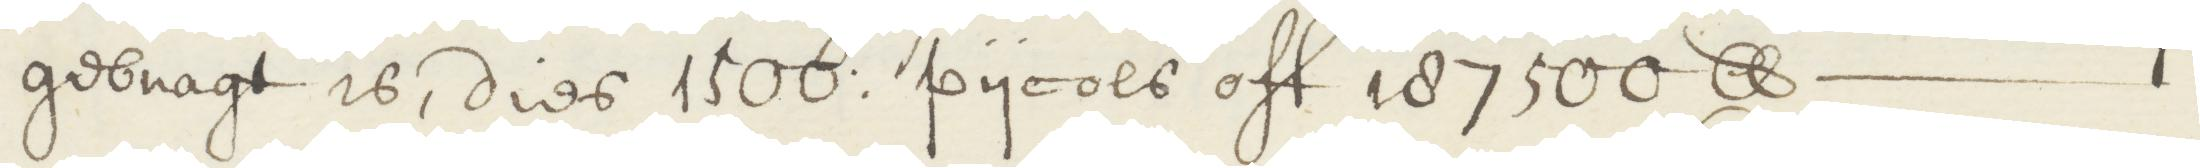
gebragt is, dies 1500: pijcols off 187500 lb —
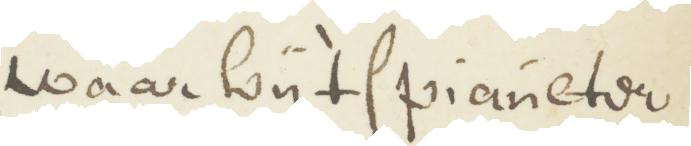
waar bij ’t spiaulter
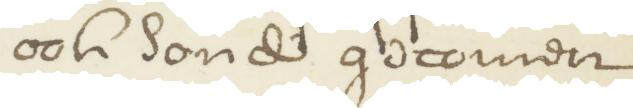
ook soude gecomen
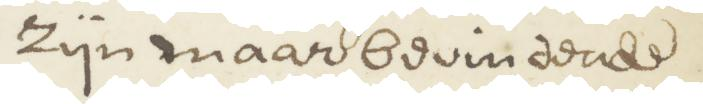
zijn maar bevindende
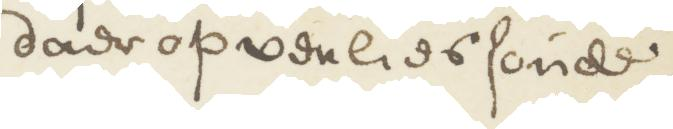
daer op verlies soude
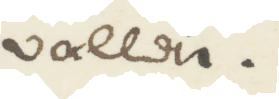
vallen.
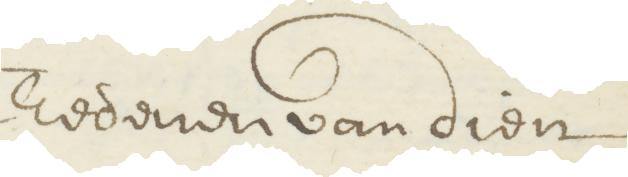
heden en van dien
